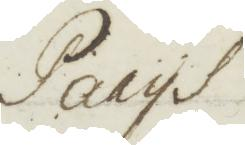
Parijs
